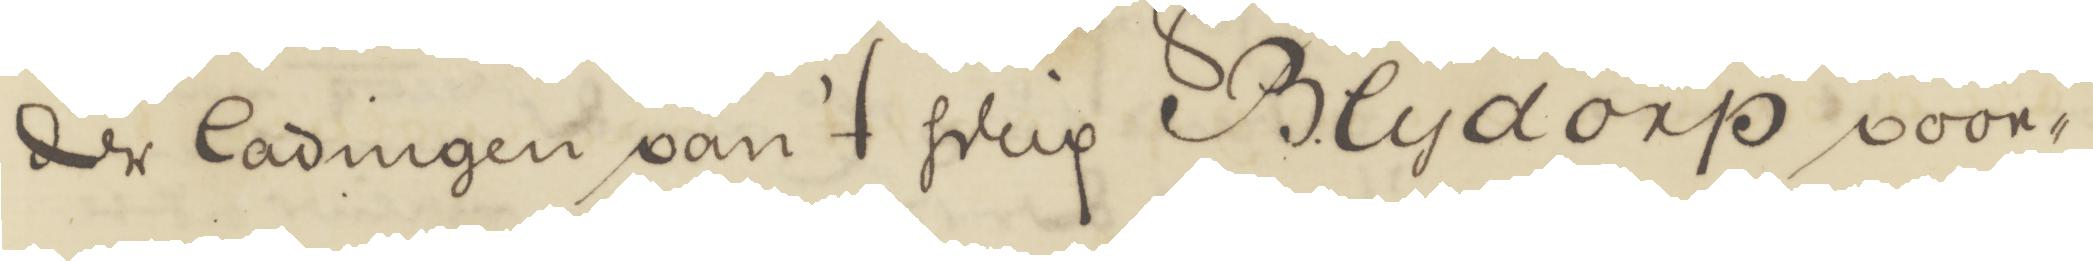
der ladingen van ’t schip Blydorp voor„
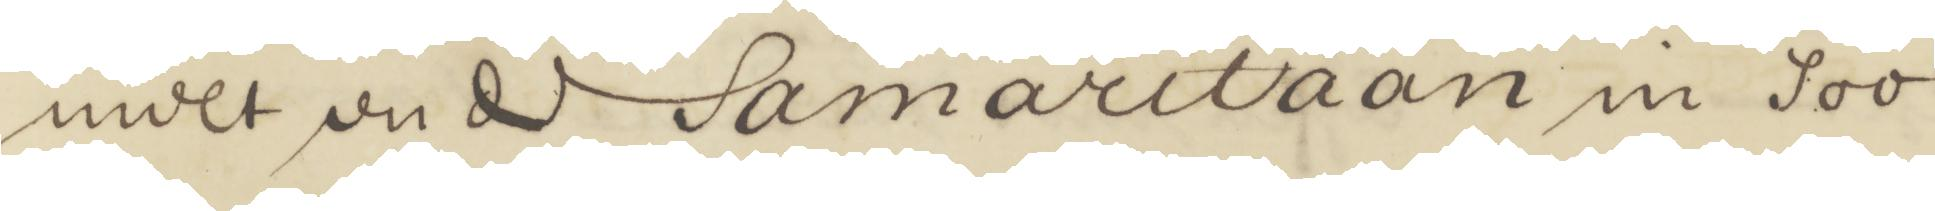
melt en de samaritaan in soo
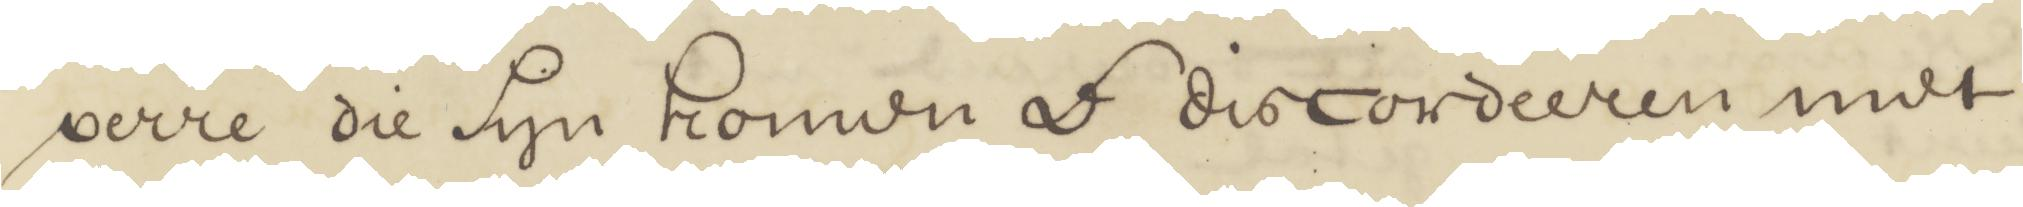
verre die sijn komen te discordeeren met
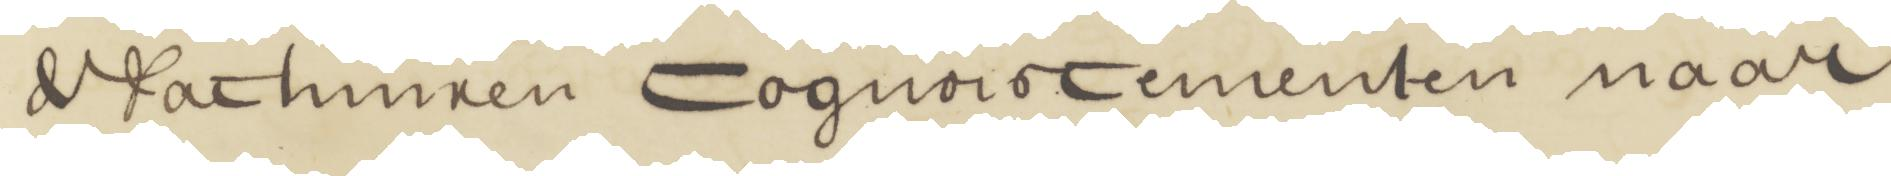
de factuuren cognoiscementen naar
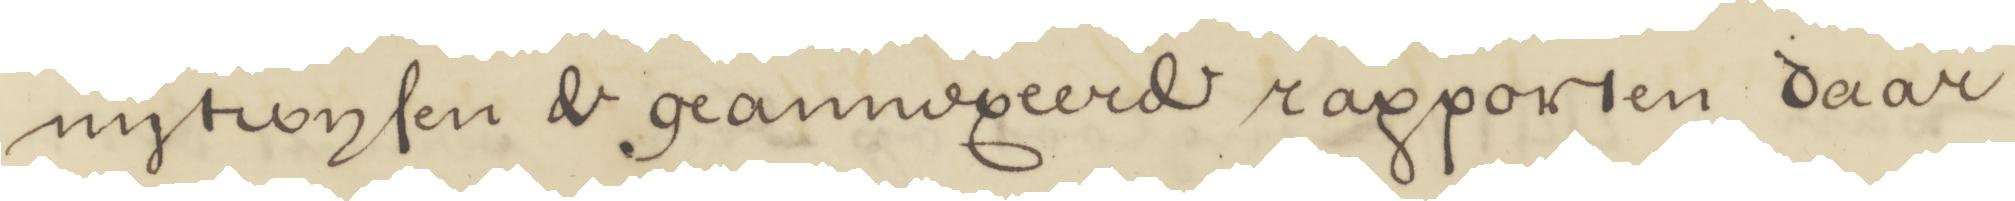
uijtwysen de geannexeerde rapporten daar
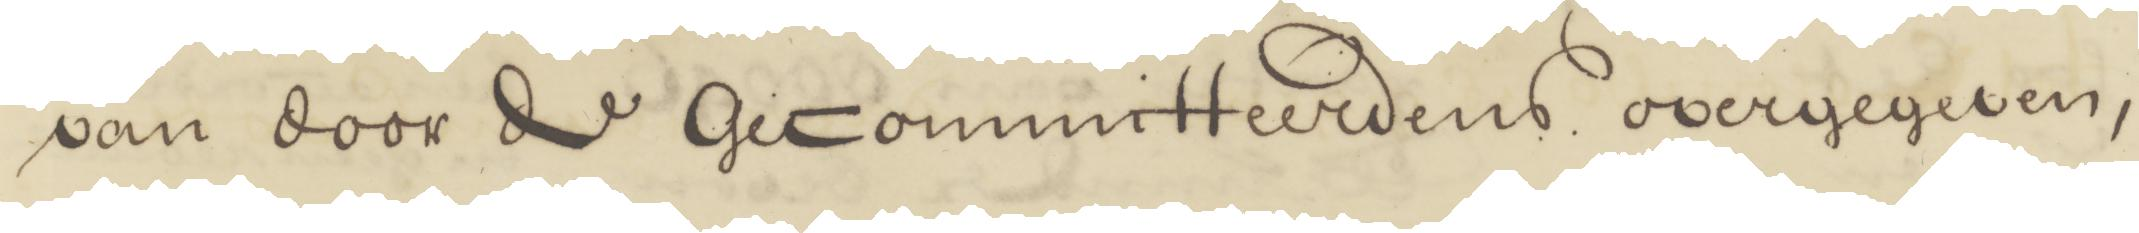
van door de gecommitteerdens overgegeven,
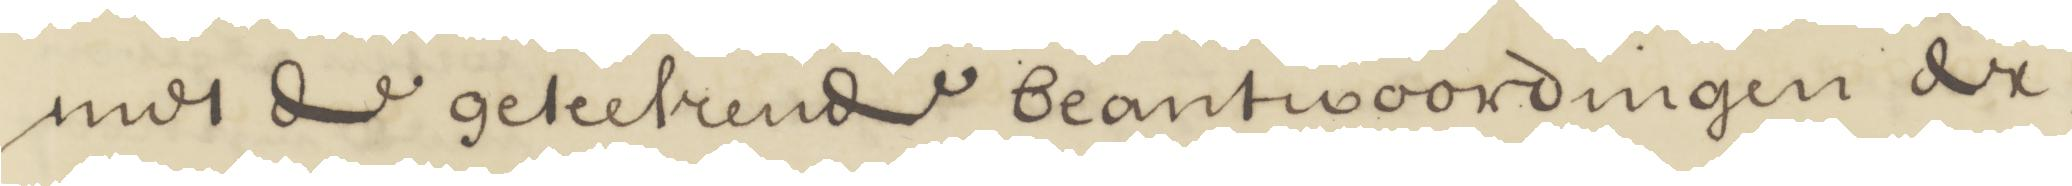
met de geteekende beantwoordingen der
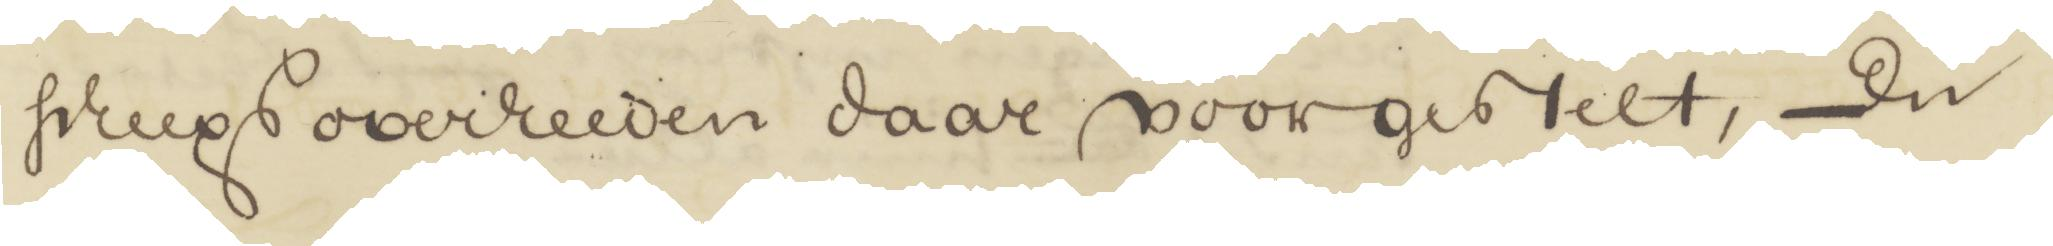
scheeps overheeden daar voor gestelt, En
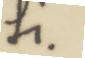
si
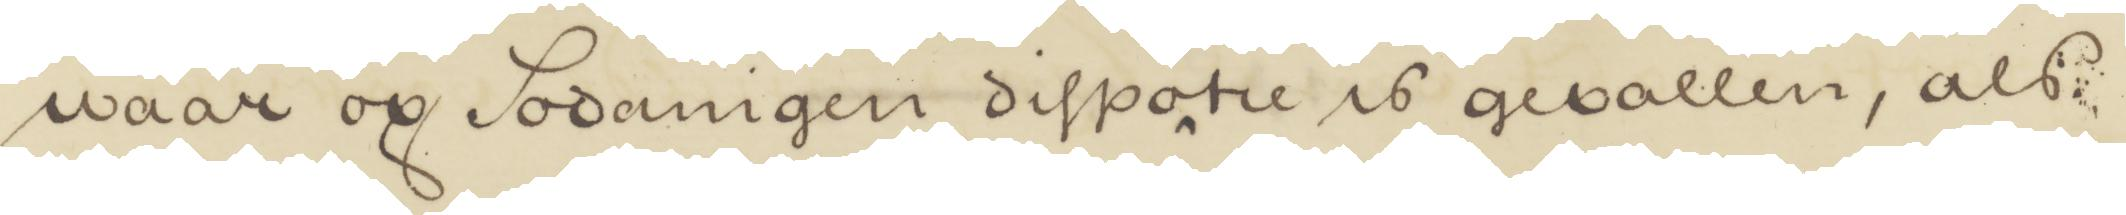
waar op sodanigen dispo^tie is gevallen, als
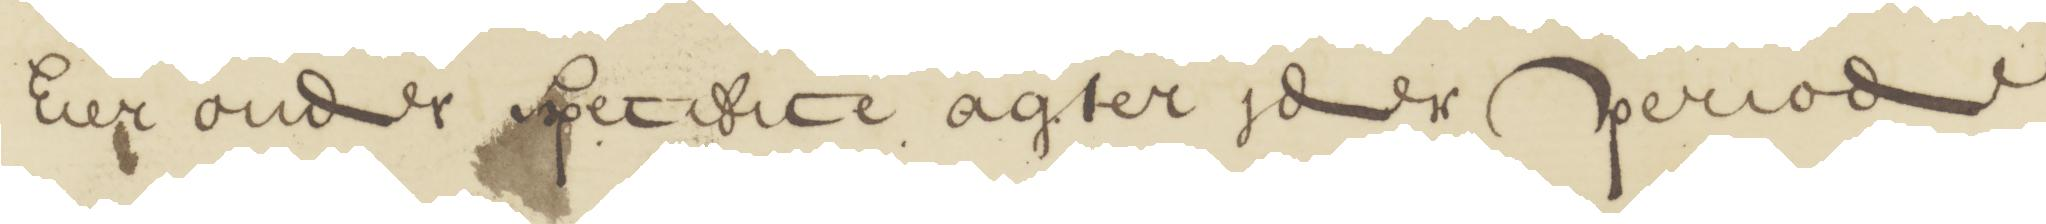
hier onder specifice agter jder periode
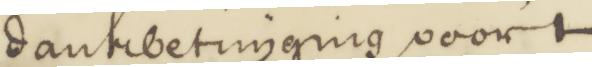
dankbetuijging voor’t
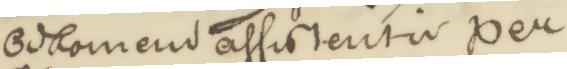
bekomene assistentie per
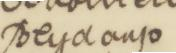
Blydorp
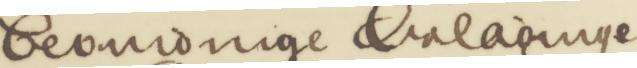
bevindinge der ladinge
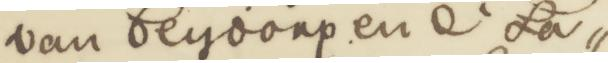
van blydorp en d' sa„
